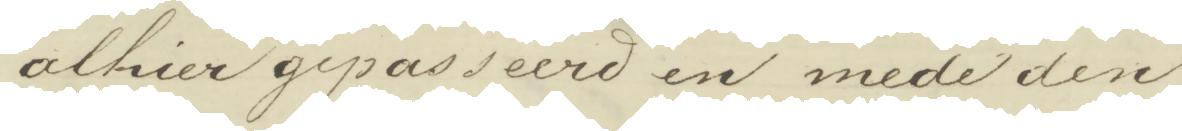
alhier gepasseerd en mede den
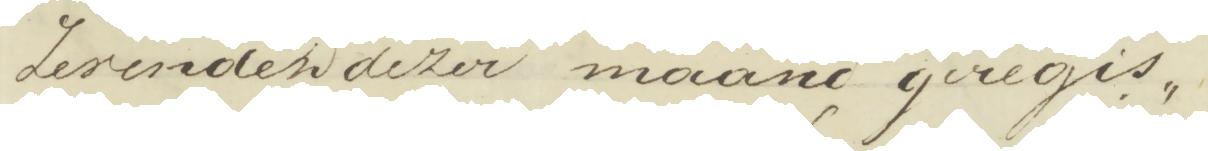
zevenden dezer maand geregis„
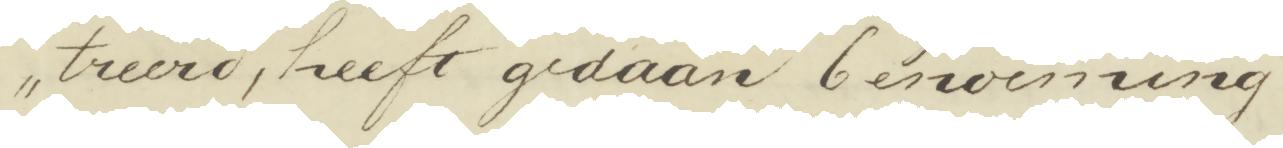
„treerd, heeft gedaan benoeming
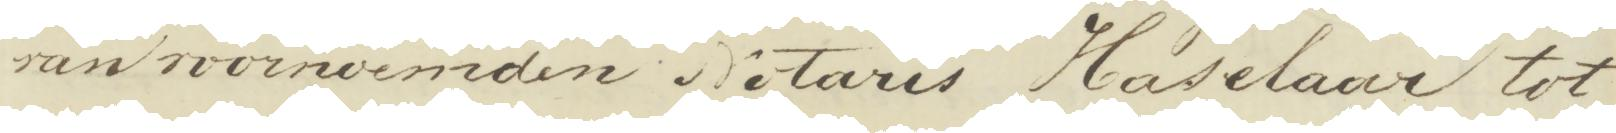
van voornoemden Notaris Haselaar tot
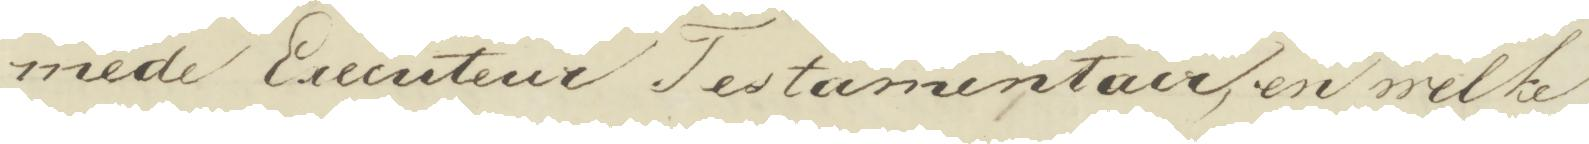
mede Executeur Testamentair, en welke
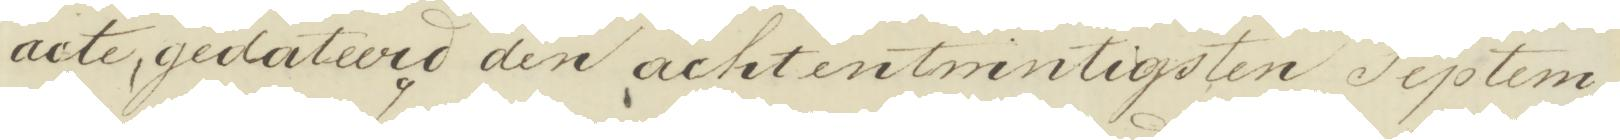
acte, gedateerd den acht en twintigsten Septem
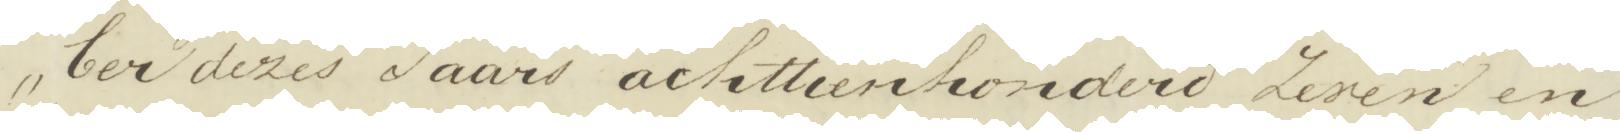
„ ber dezes Jaars achttienhonderd zeven en
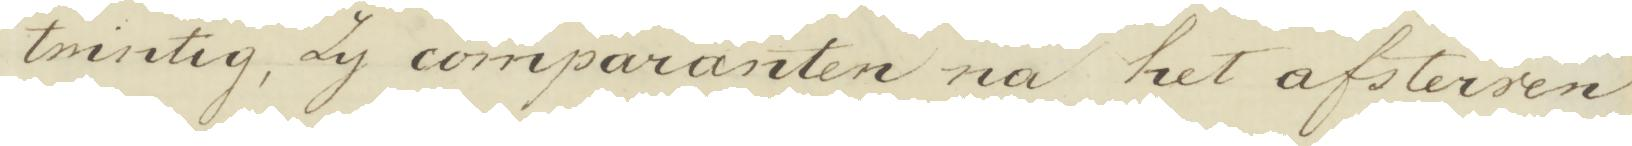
twintig, zy comparanten na het afsterven
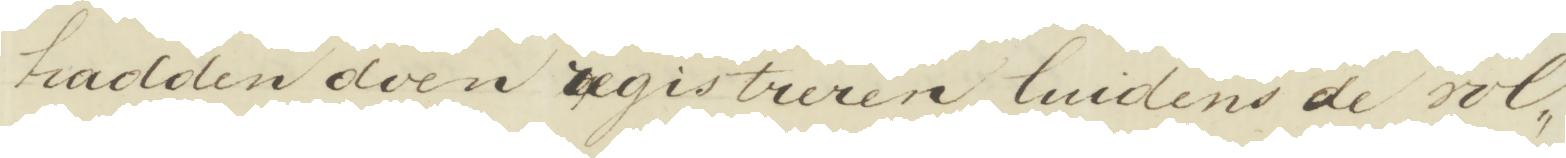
hadden doen registreren, luidens de vol„
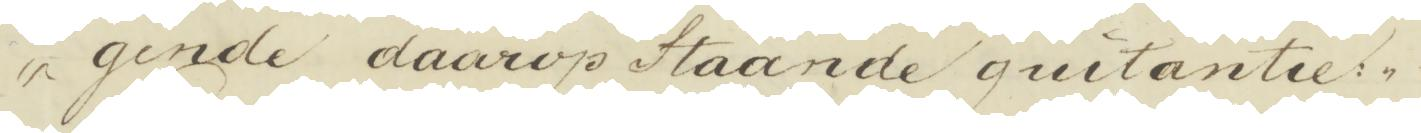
„ gende daarop staande quitantie: „
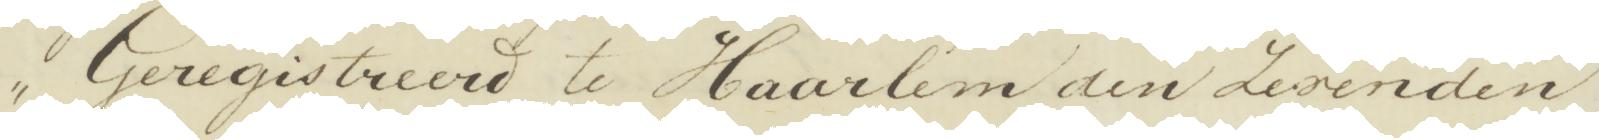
„ Geregistreerd te Haarlem den zevenden
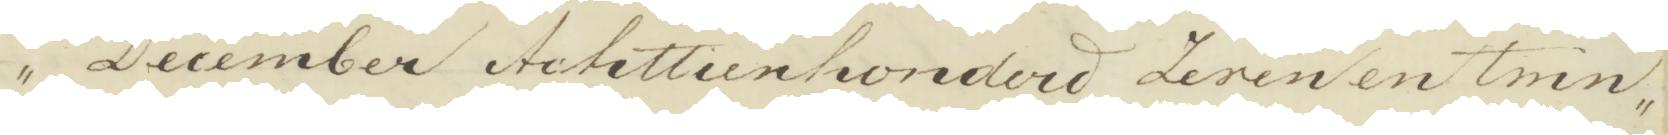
„ December Achttienhonderd zeven en twin„
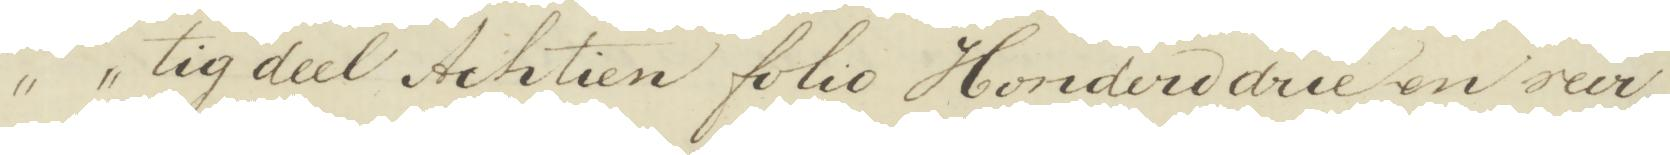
„ „ tig deel Achtien folio Honderd drie en veer
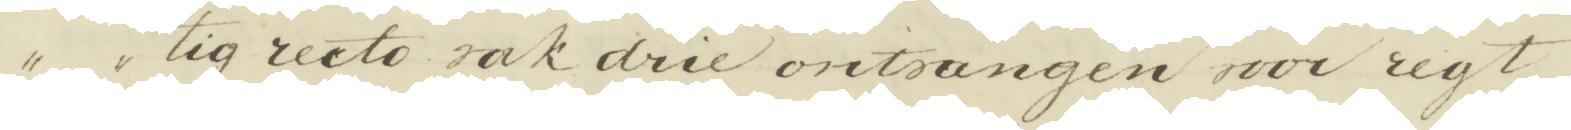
„ „ tig recto vak drie ontvangen voor regt
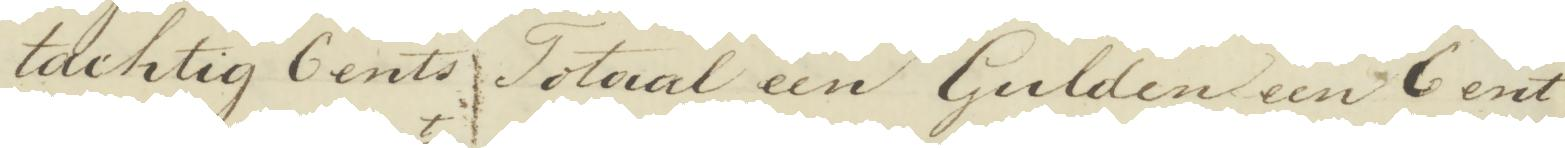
tachtig Cents. Totaal een Gulden een Cent
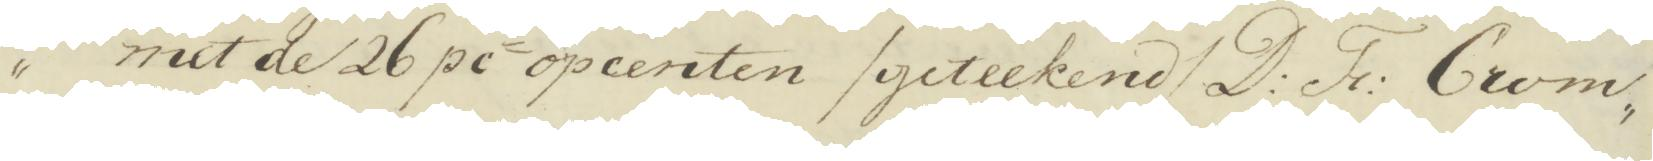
„ met de 26 pc= op centen /geteekend/ D: F: Crom„
